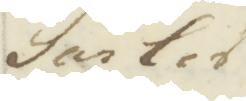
Sarles
